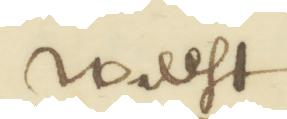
weest
